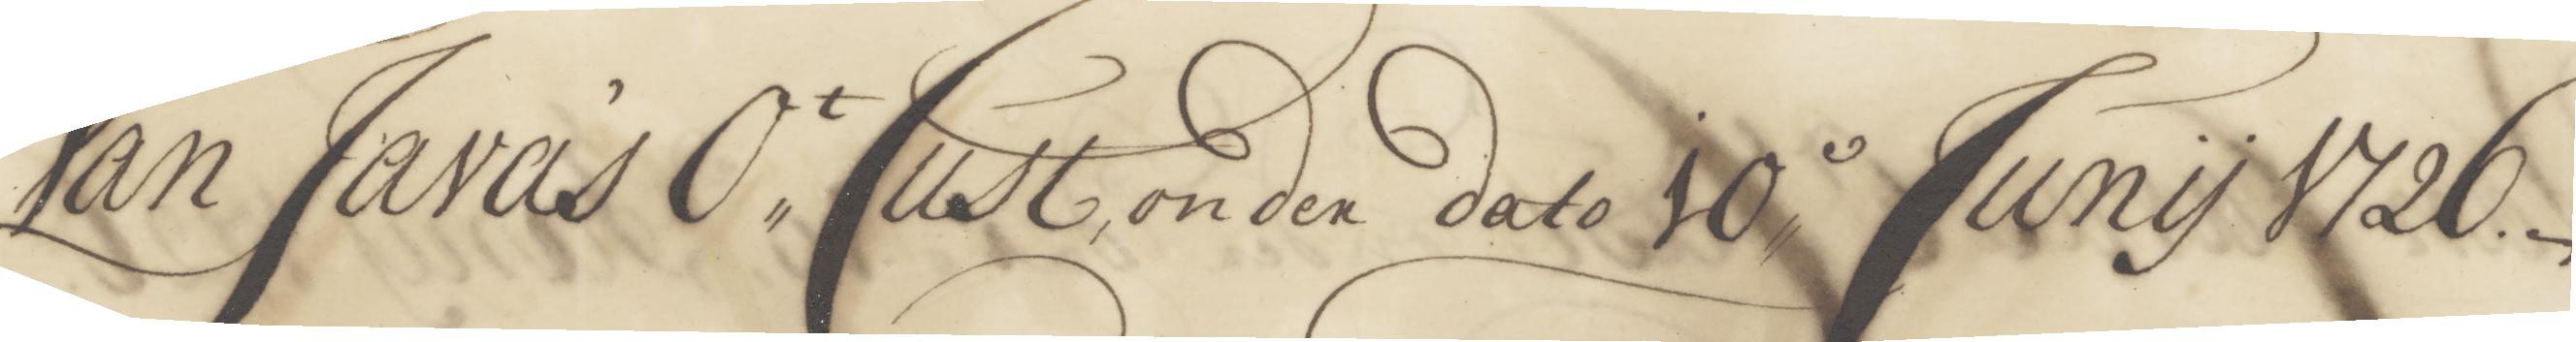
Van Java's O„t Cust, onder dato 10„e Junij 1726. —
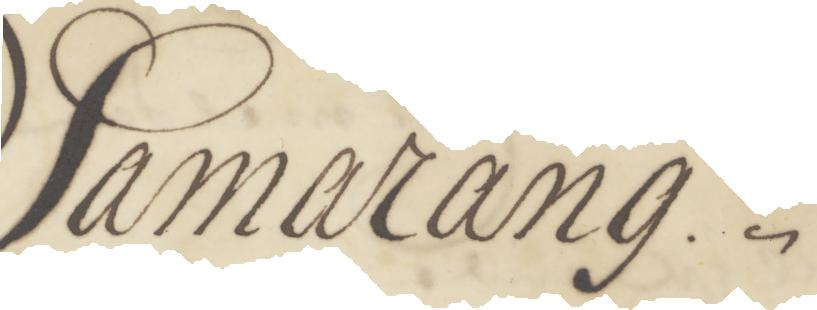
Samarang. —
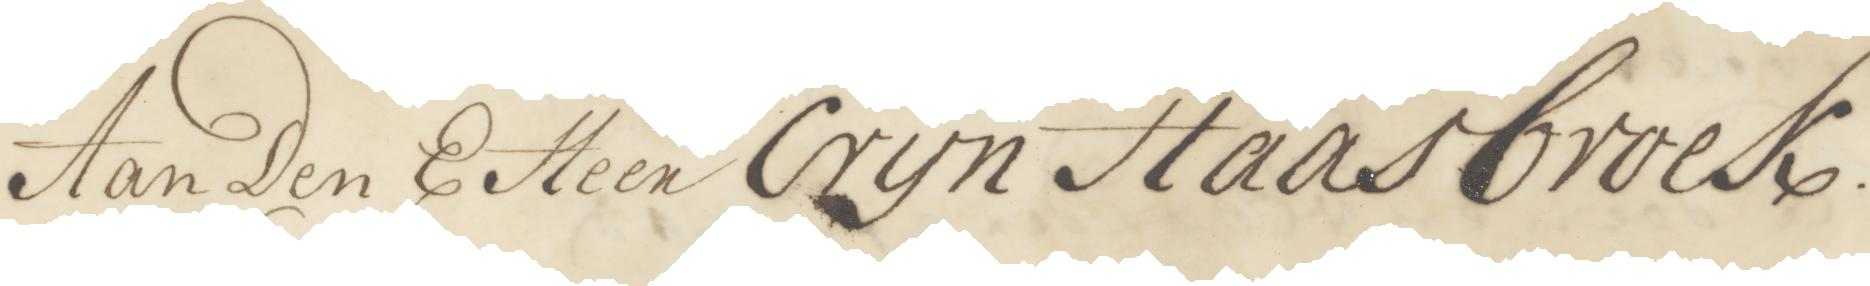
Aan Den E Heer Crijn Haasbroek.
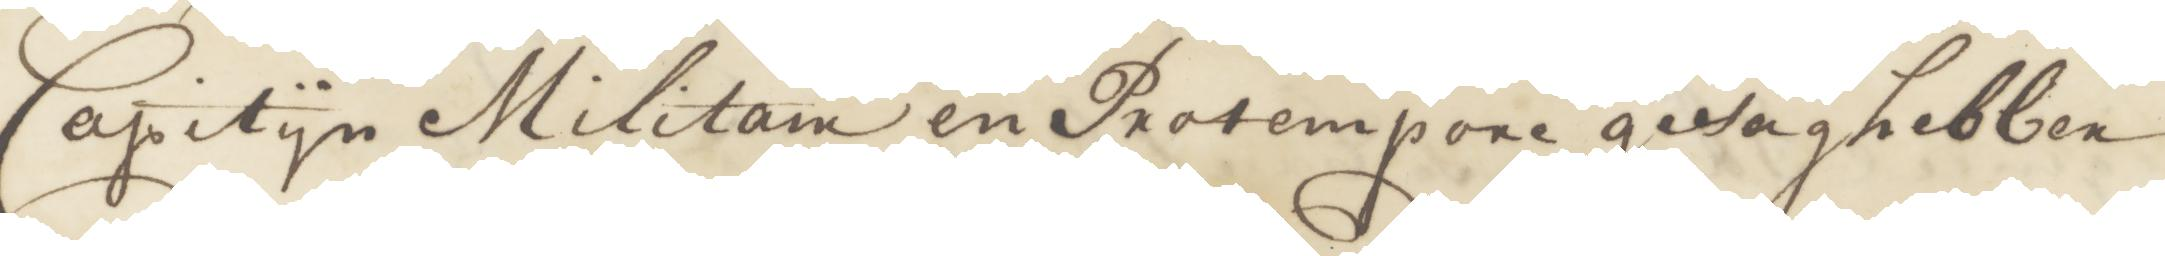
Capitijn Militair en Protempore gesaghebber
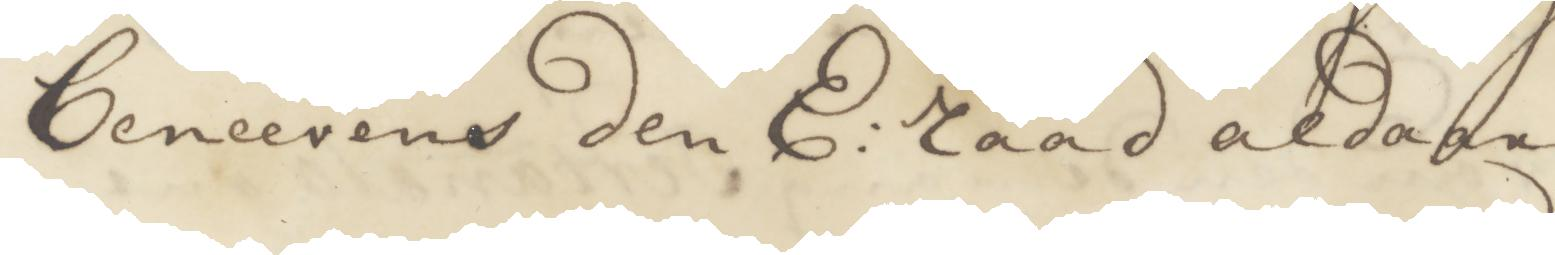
beneevens den E: raad aldaar
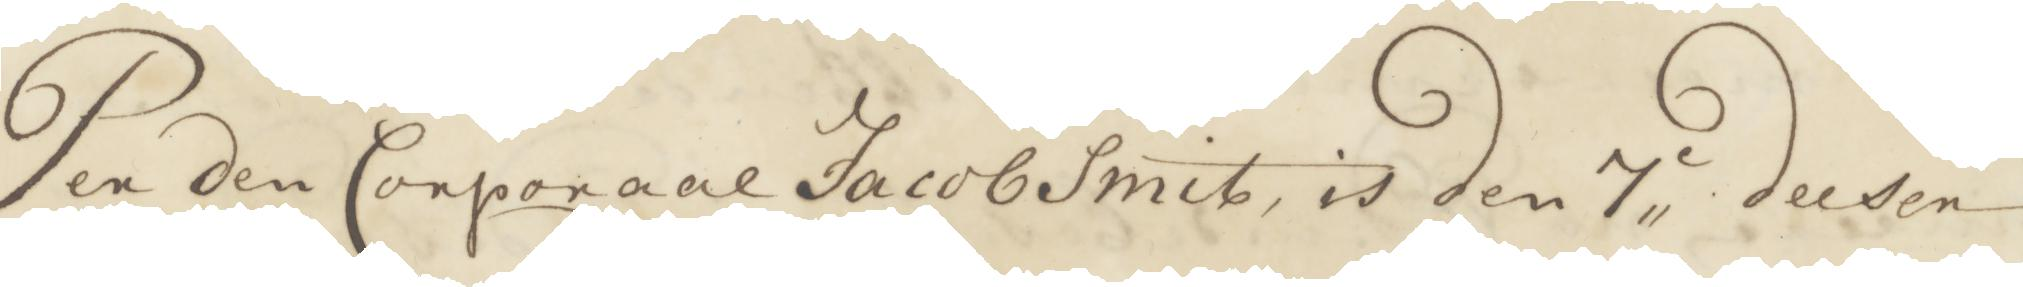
Per den Corporaal Iacob Smit, is den 7„e deeser
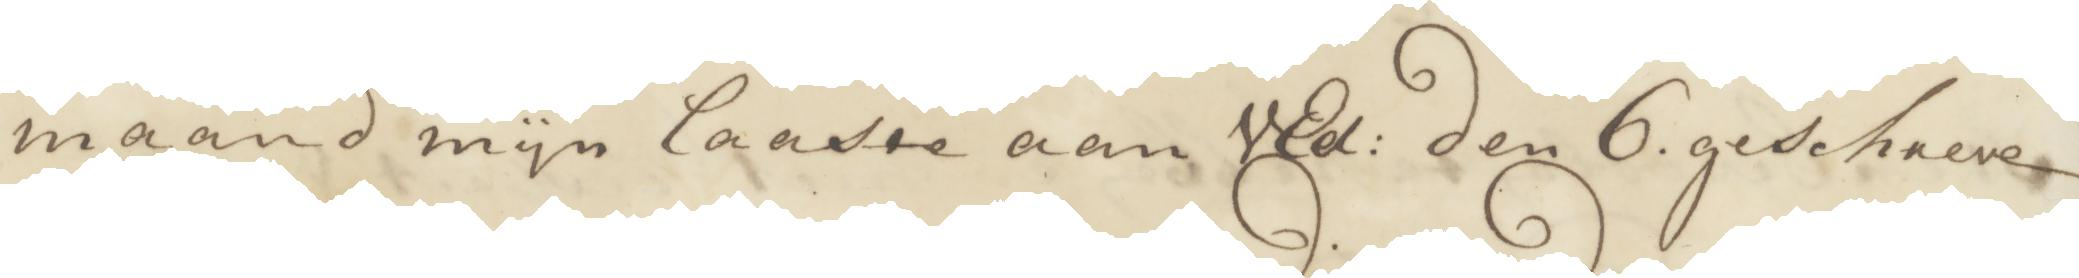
maand mijn laaste aan VEd: den 6. geschreven
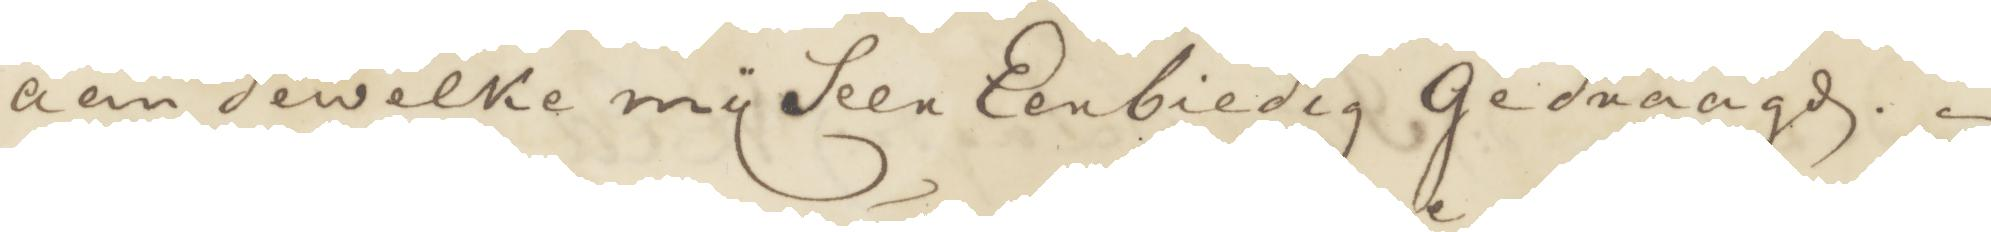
aan dewelke mij seer Eerbiedig gedraagen. —
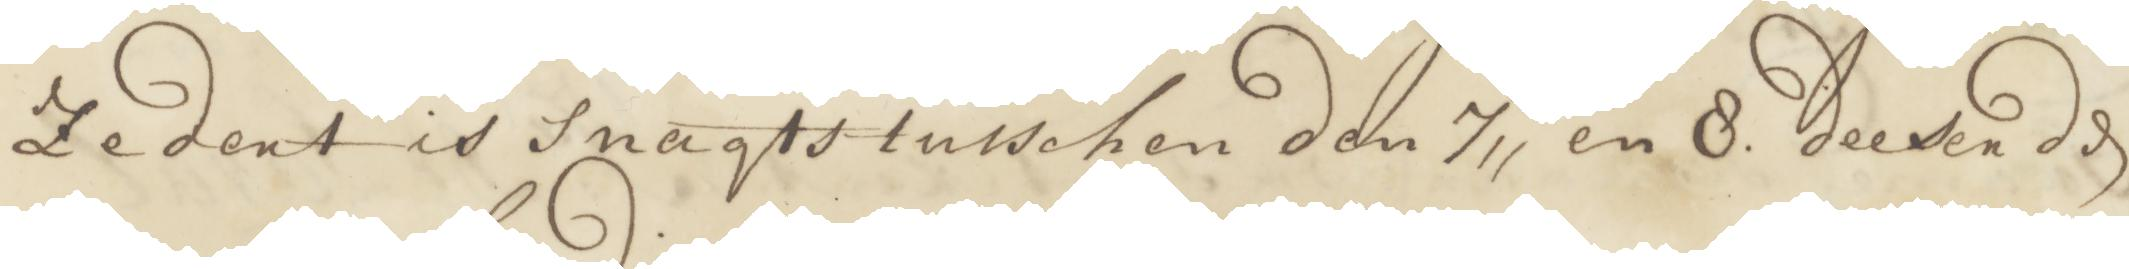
Zedert is snagts tusschen den 7„e en 8. deeser den
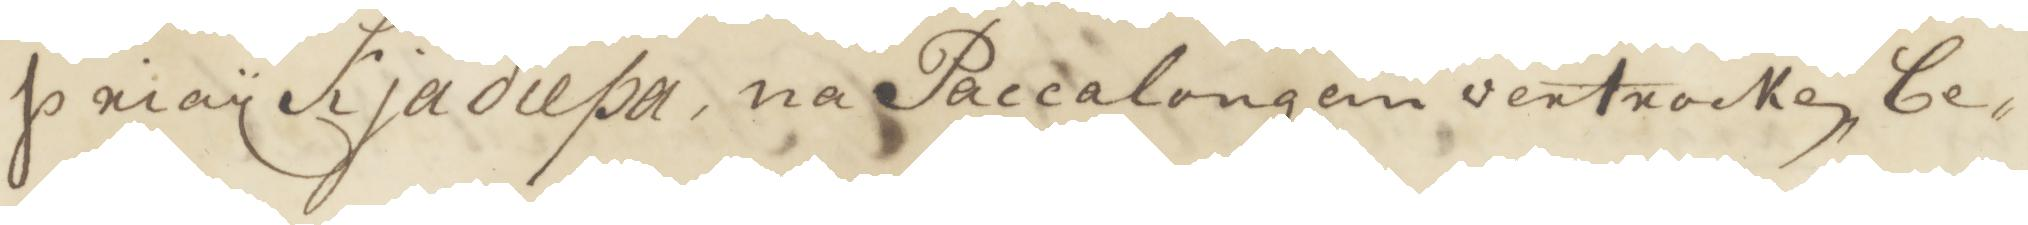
priaij Kjadiepa, na Paccalongan vertrocken, be„
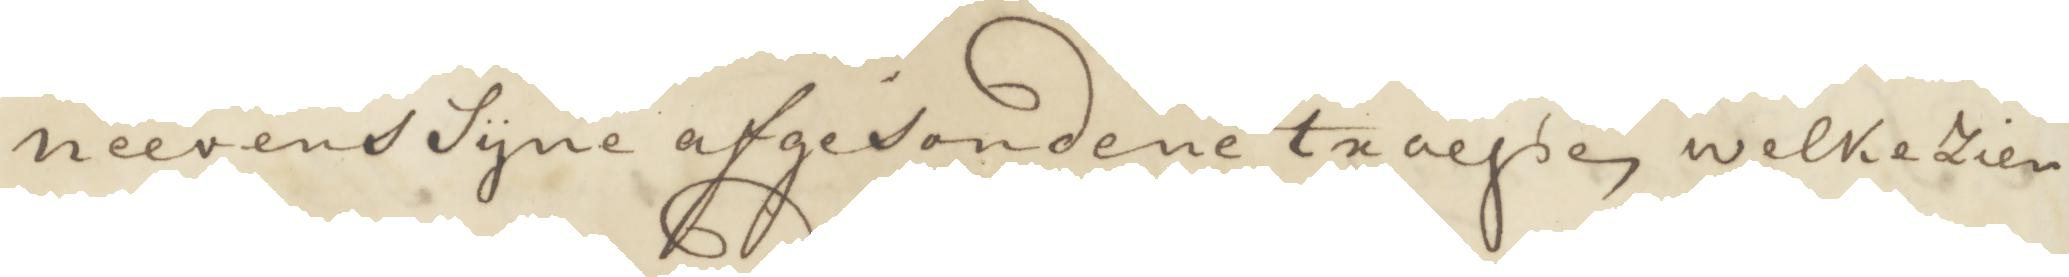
neevens sijne afgesondene troepen welke zien
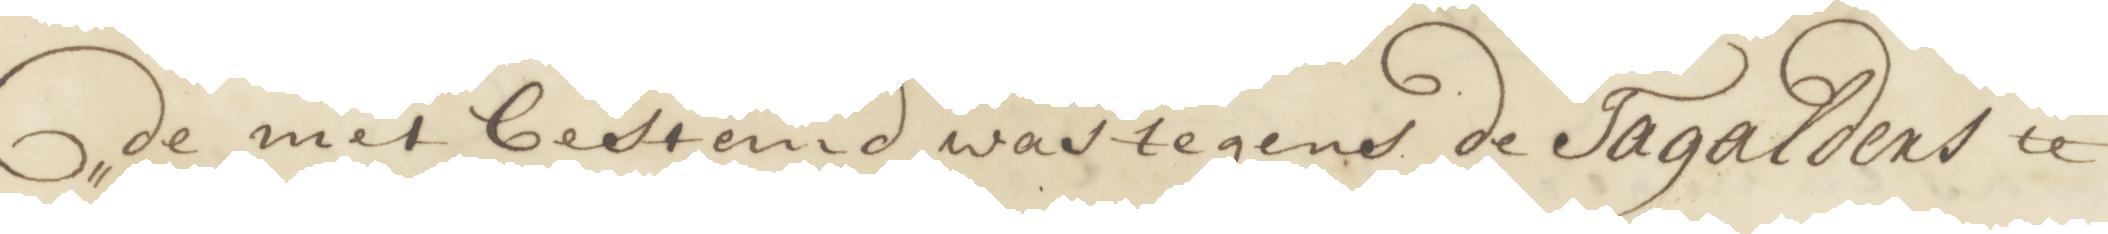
„de niet bestand was tegens de Tagalders te
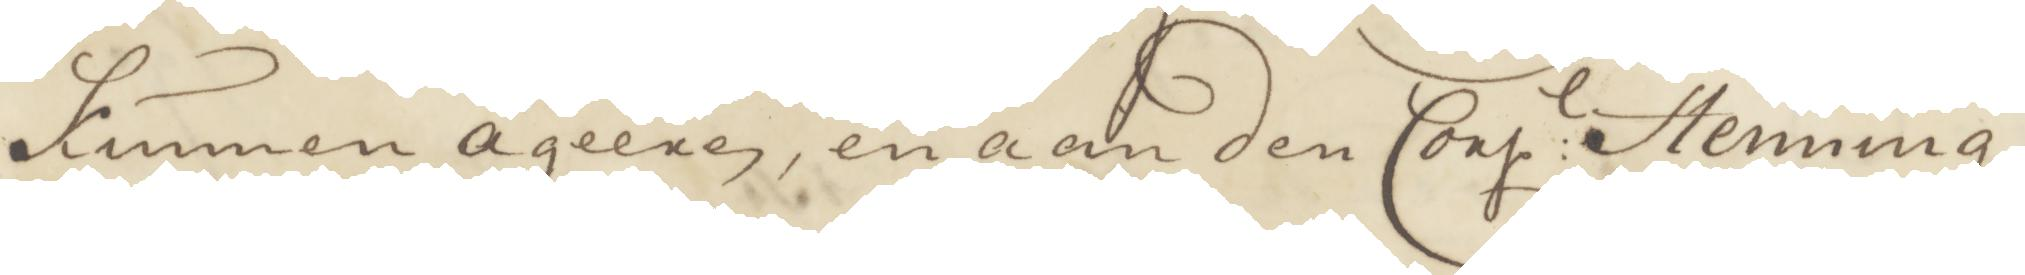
kunnen ageeren, en aan den Corp:l Henning
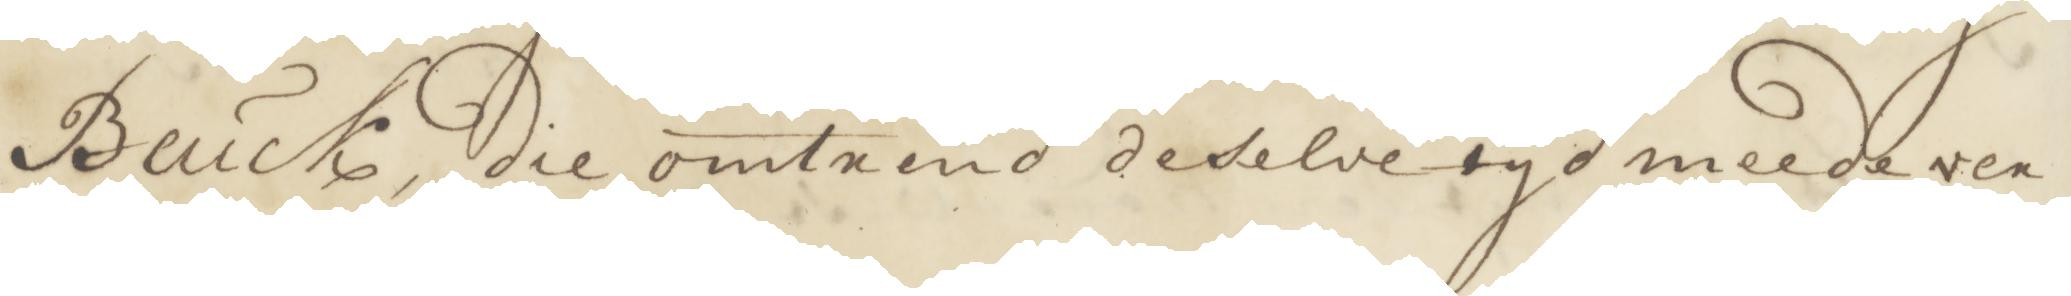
Beuck, die omtrend deselve tijd meede ver
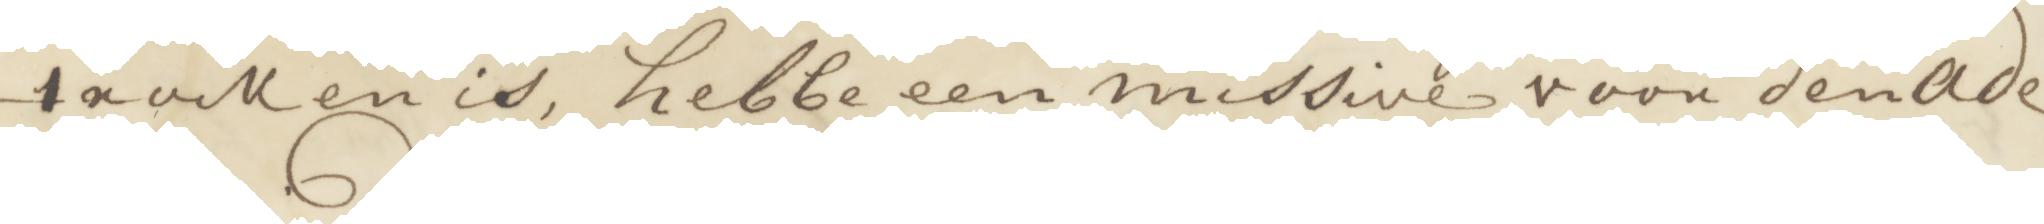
trocken is, hebbe een missive voor den ade
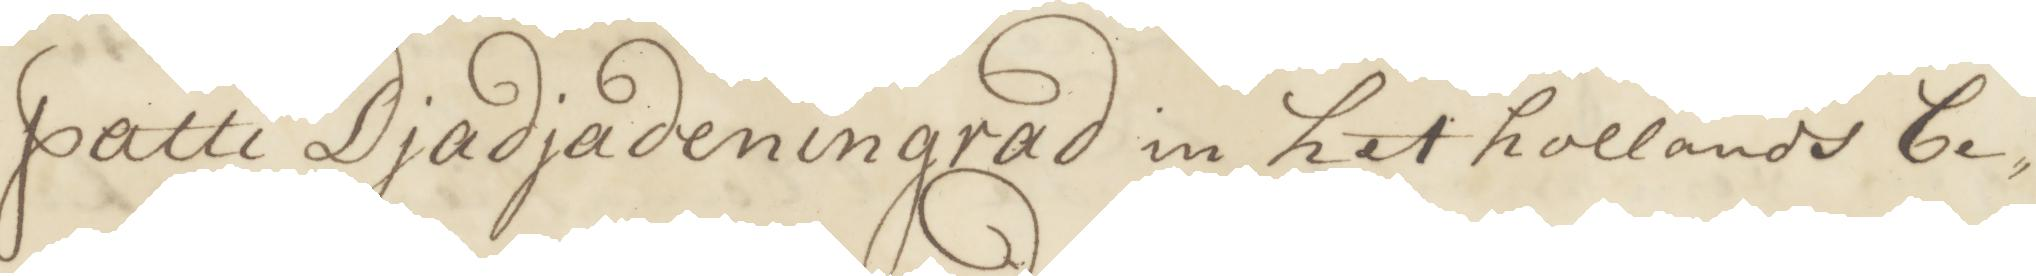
patti Djadjadeningrad in het hollands be„
